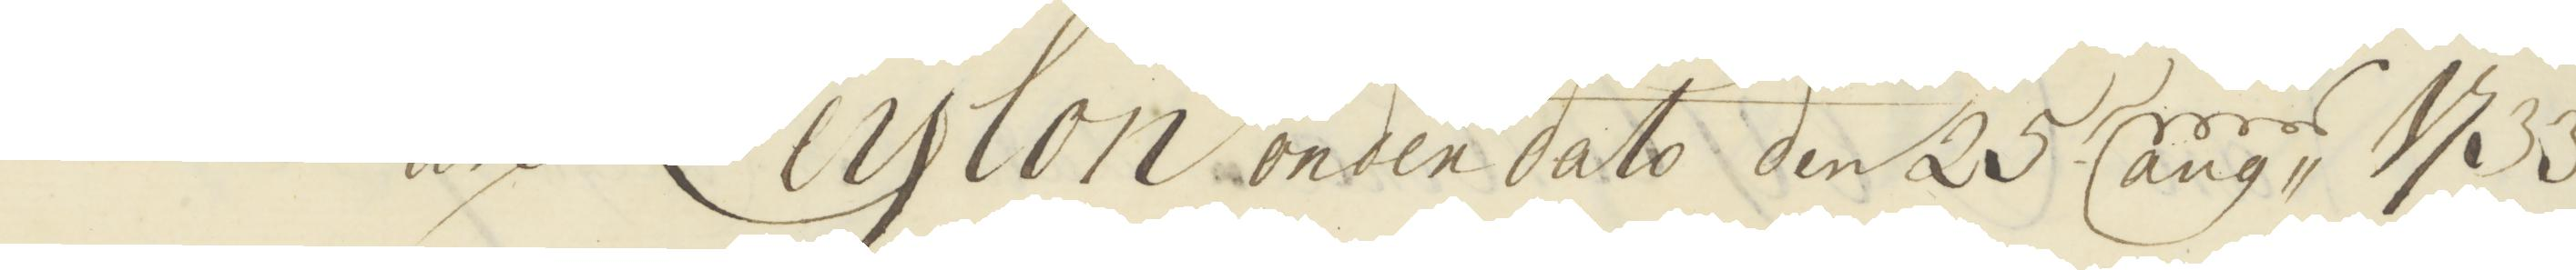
Van Ceijlon onder dato den 25: ' aug„s 1733
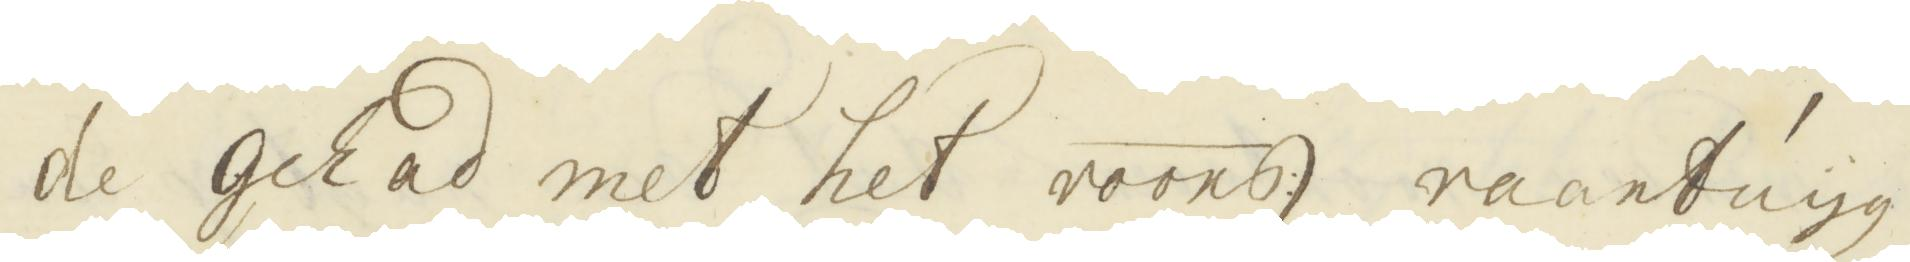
de gehad met het voors: vaartuijg
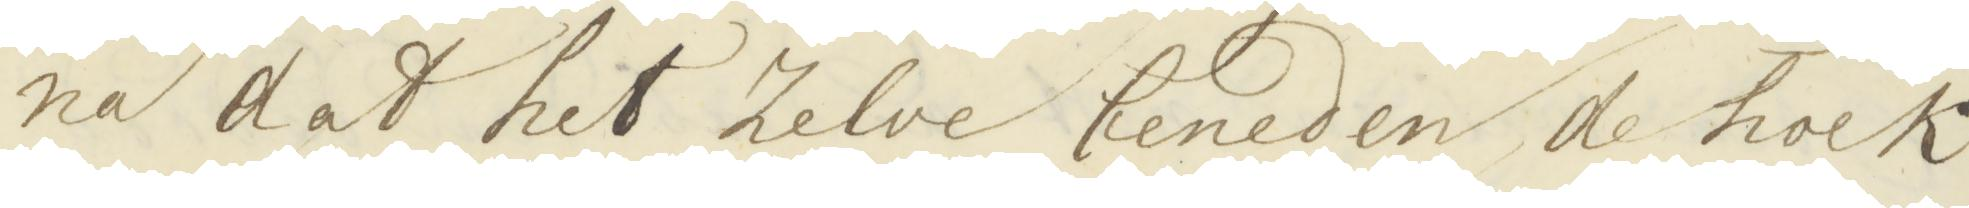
na dat het Zelve beneden, de hoek
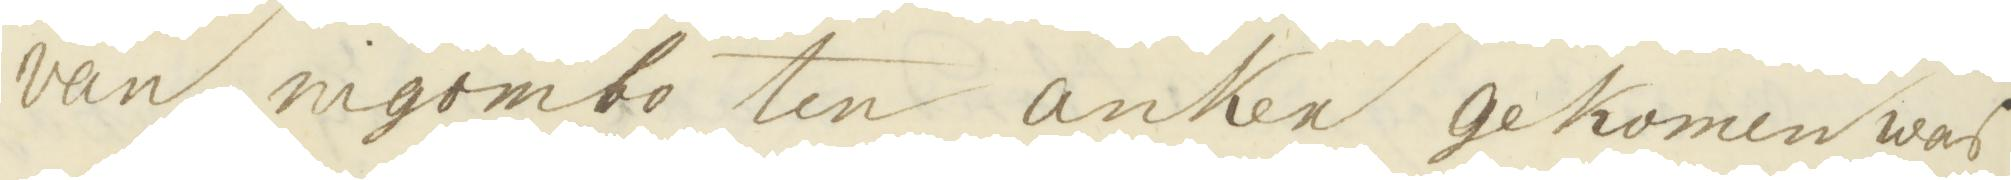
van nigombo ten anker gekomen was
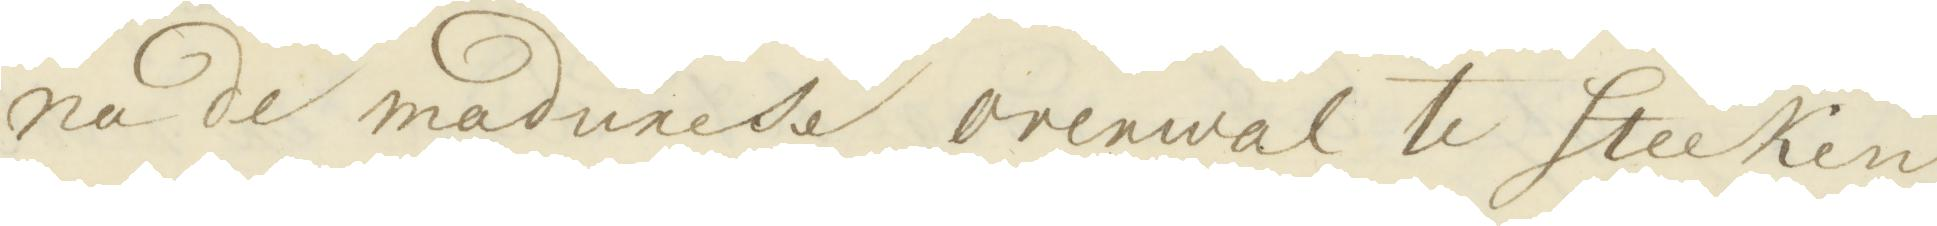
na de madurese overwal te steeken
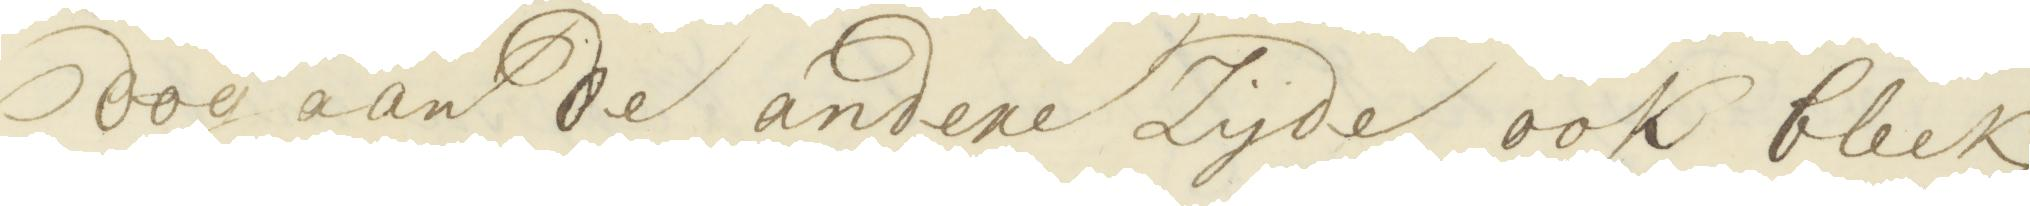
doe aan de andere Zijde ook bleek
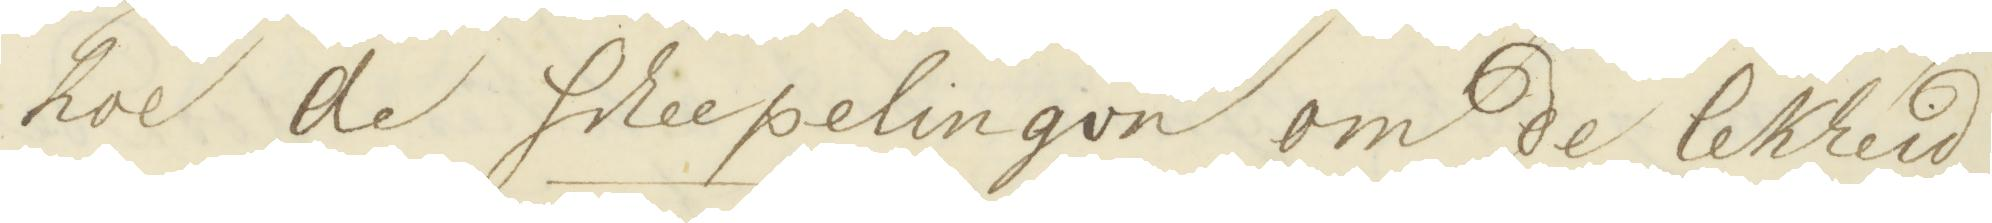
hoe de Scheepelingen om de lekheid
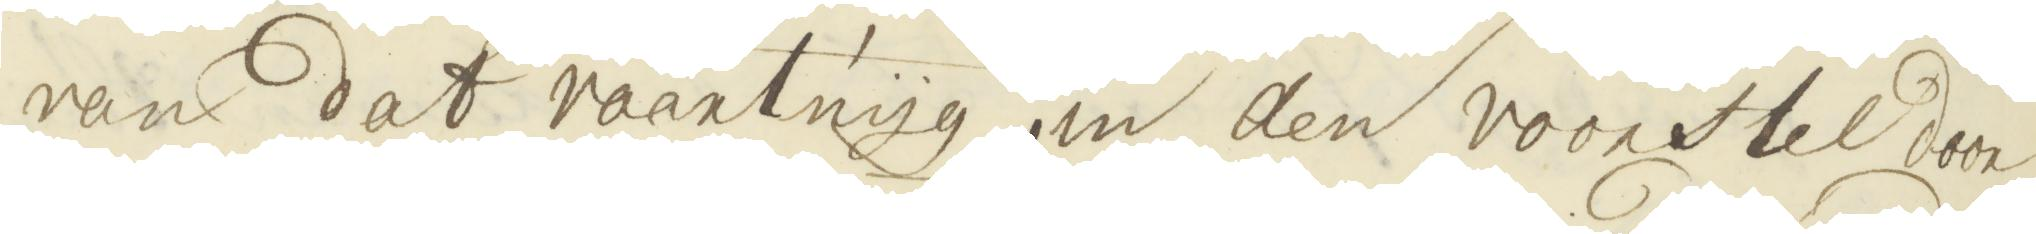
van dat voortuijg in den voorstel door
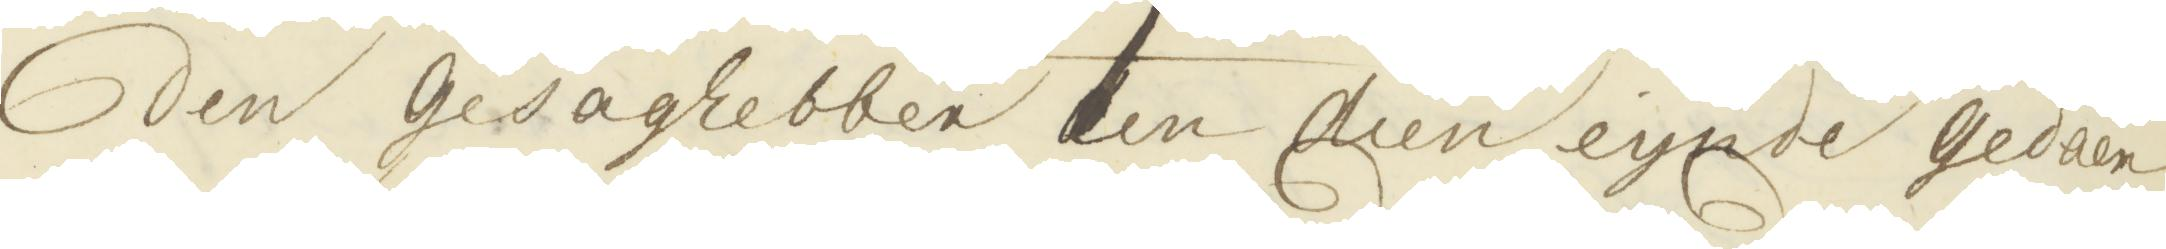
den gesaghebber den dien eijnde gedaen
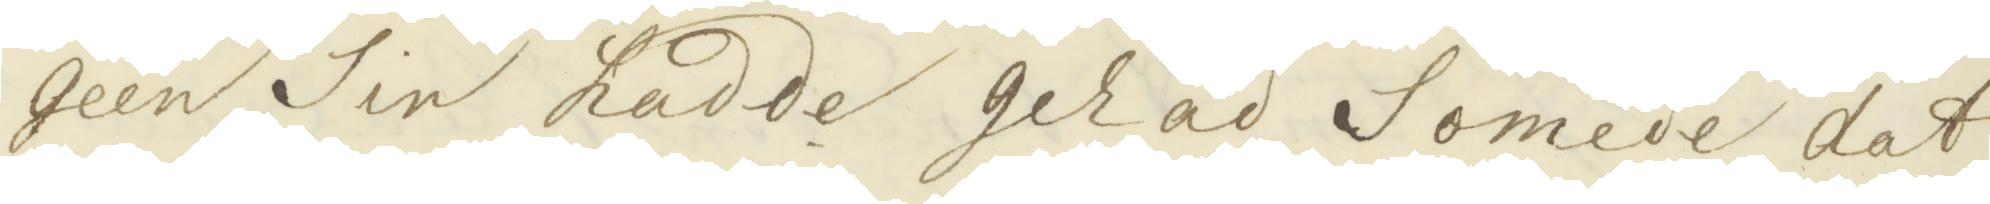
geen Sin hadde gehad Somede dat
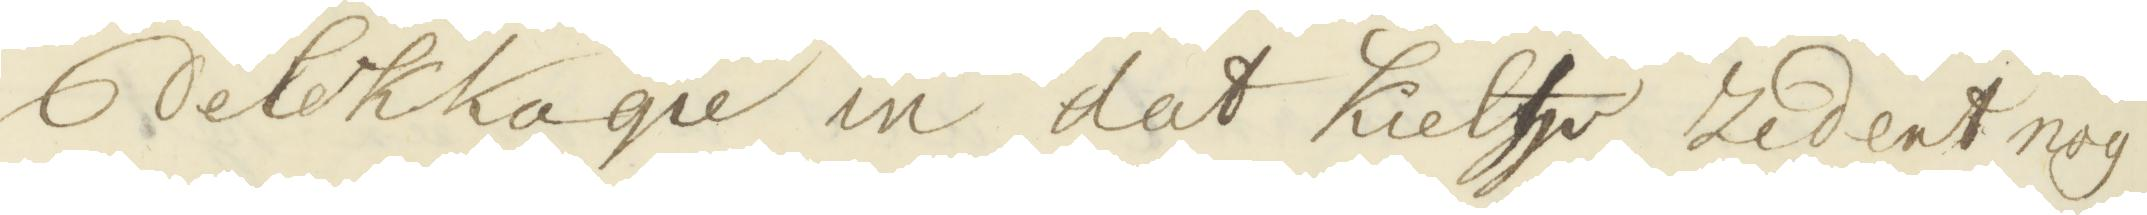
delekkagie in dat Kieltje Zedert nog
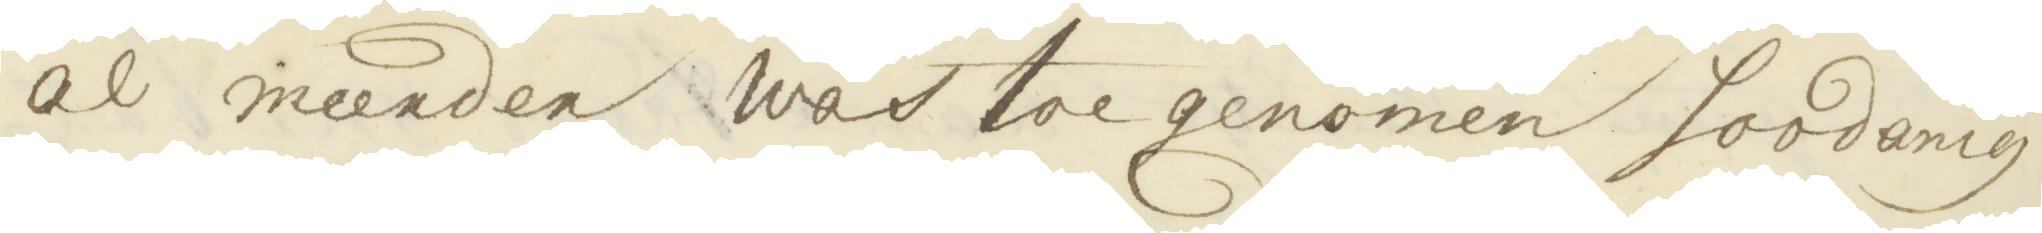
al meerder was toegenomen Soodanig
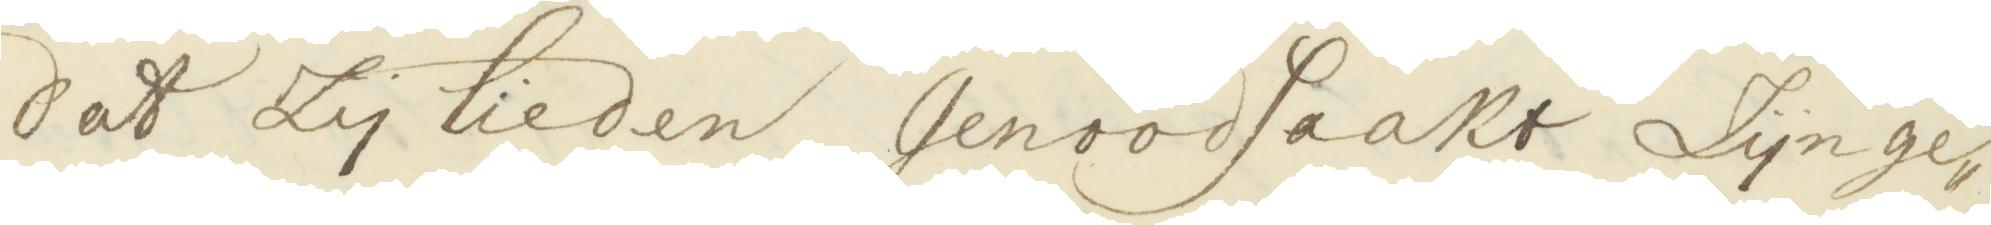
dat Zij lieden Genoodsaakt Zijn ge„
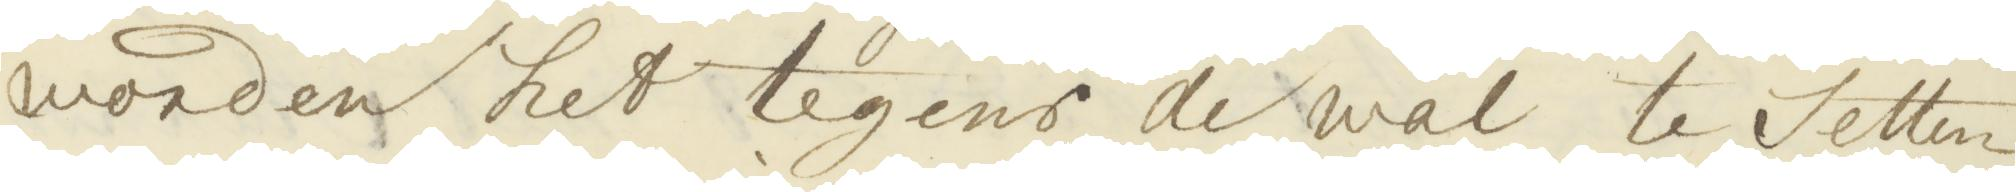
worden het tegens de wal te Setten
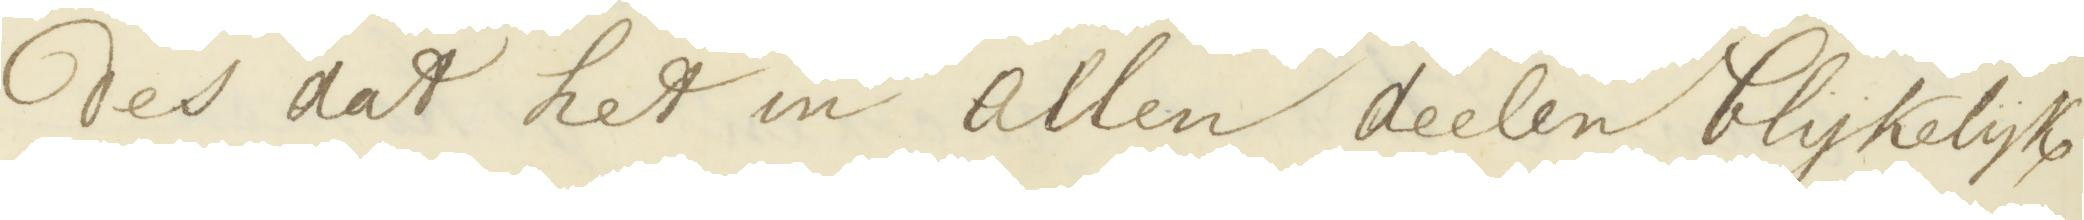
des dat het in allen deelen blijkelijk
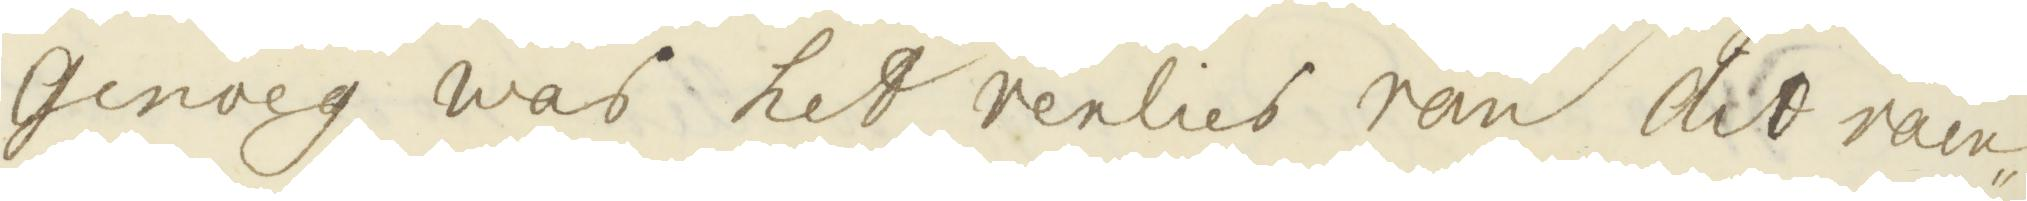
genoeg was het verlies van dit vaer„
